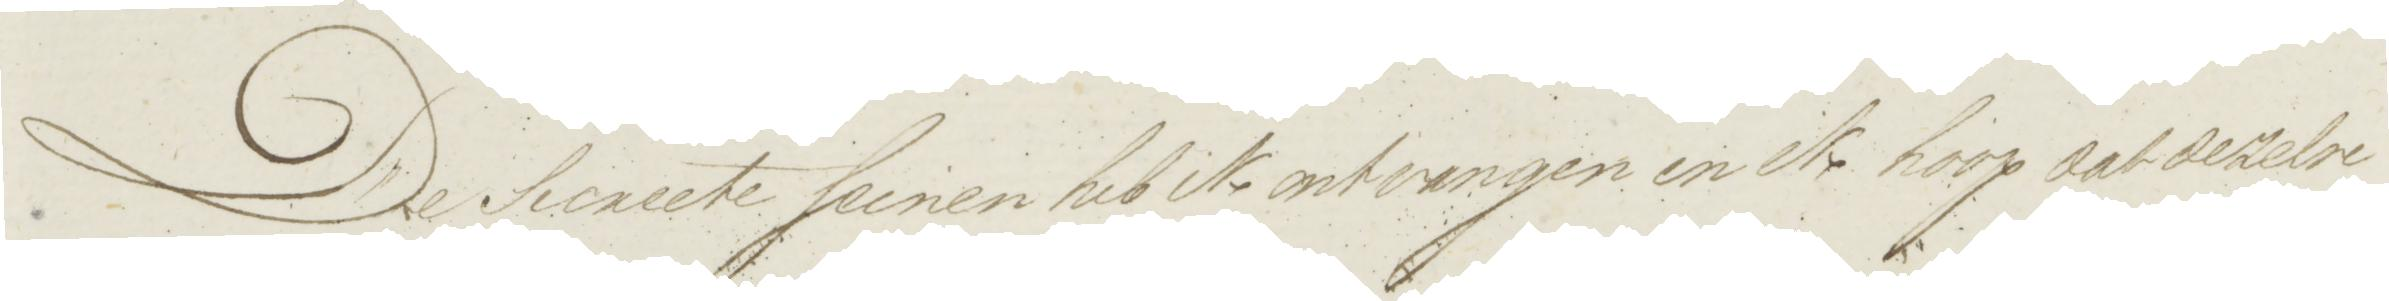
De secreete seinen heb ik ontvangen en ik hoop dat dezelve
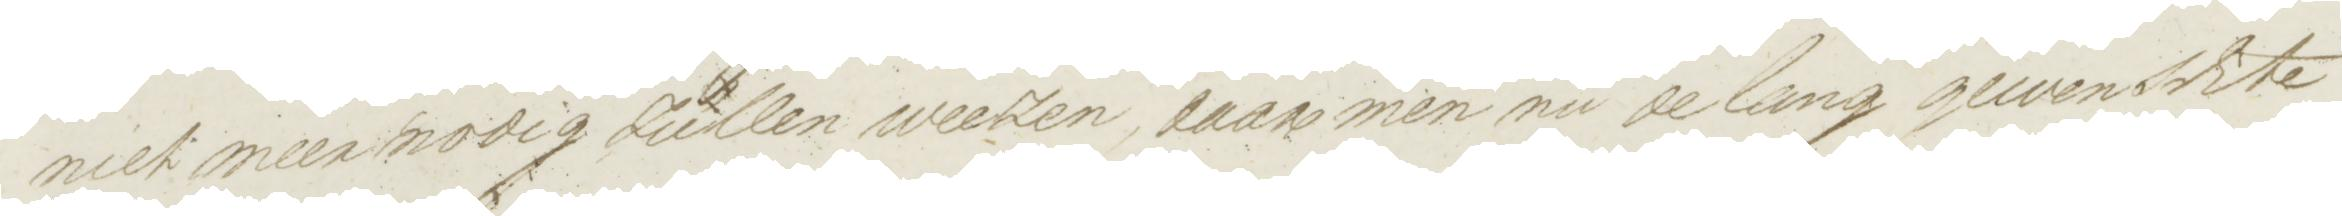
niet meer nodig zullen weezen, daar men nu de lang gewenschte
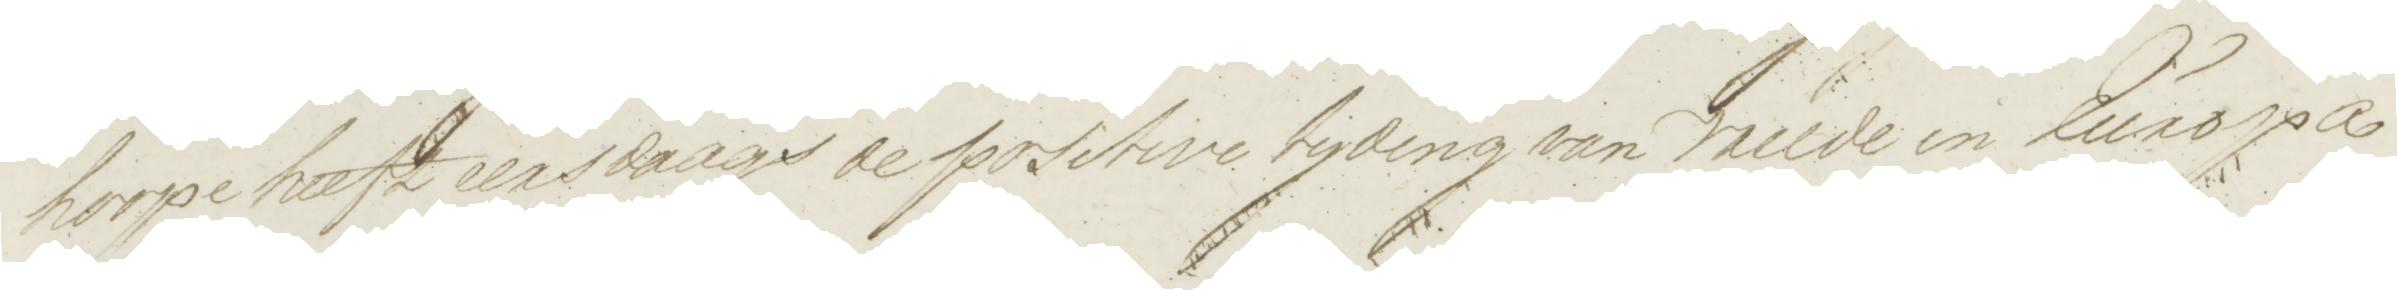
hoope heeft eersdaags de positive tijding van vreede in Europa
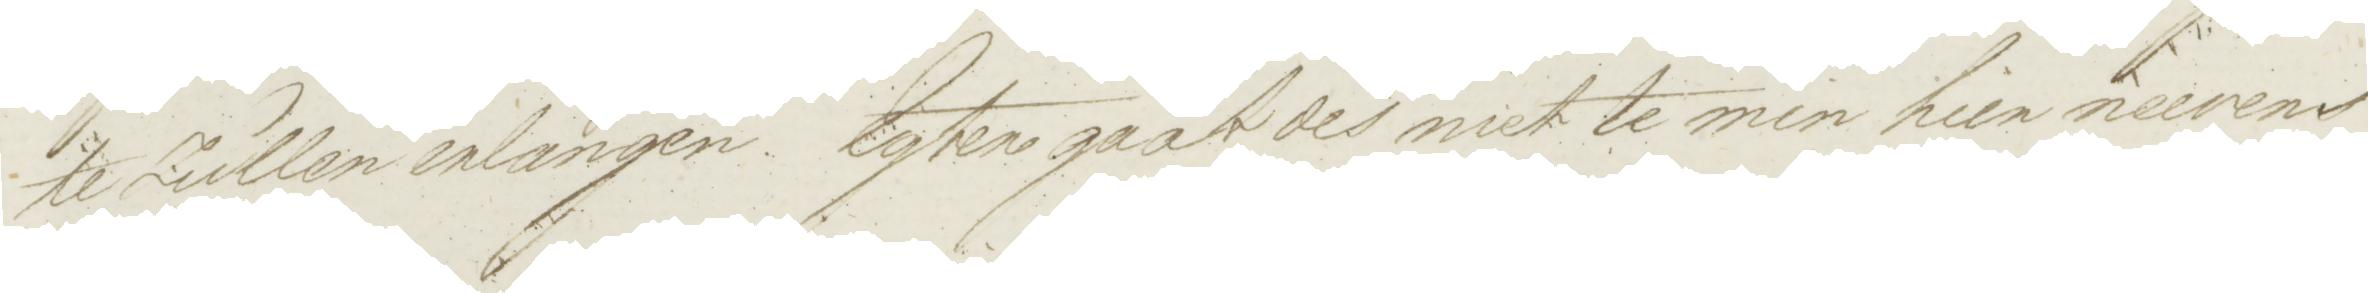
te zullen erlangen. Egter gaat des niet te min hier neevens
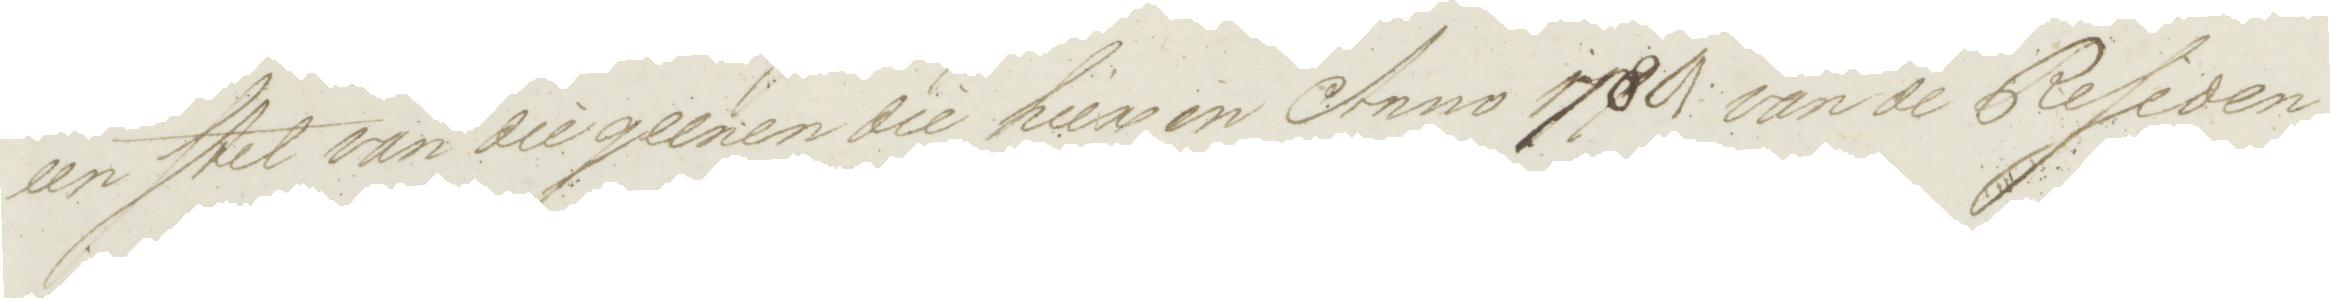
een stel van die geenen die hier in Anno 1784: van de Residen
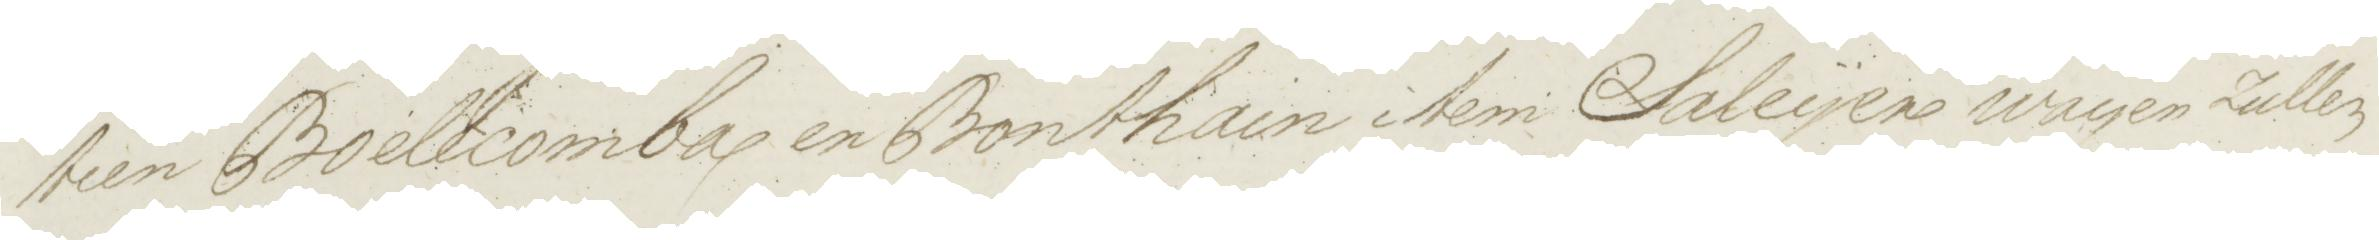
tien Boelecomba en Bonthain item Saleijer waijen zullen
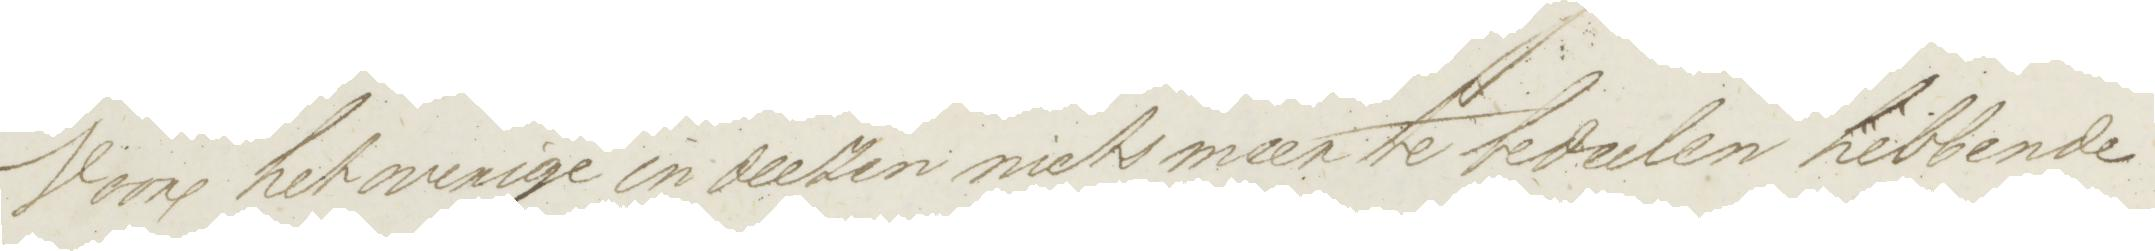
Voor het overige in deezen niets meer te bedeelen hebbende
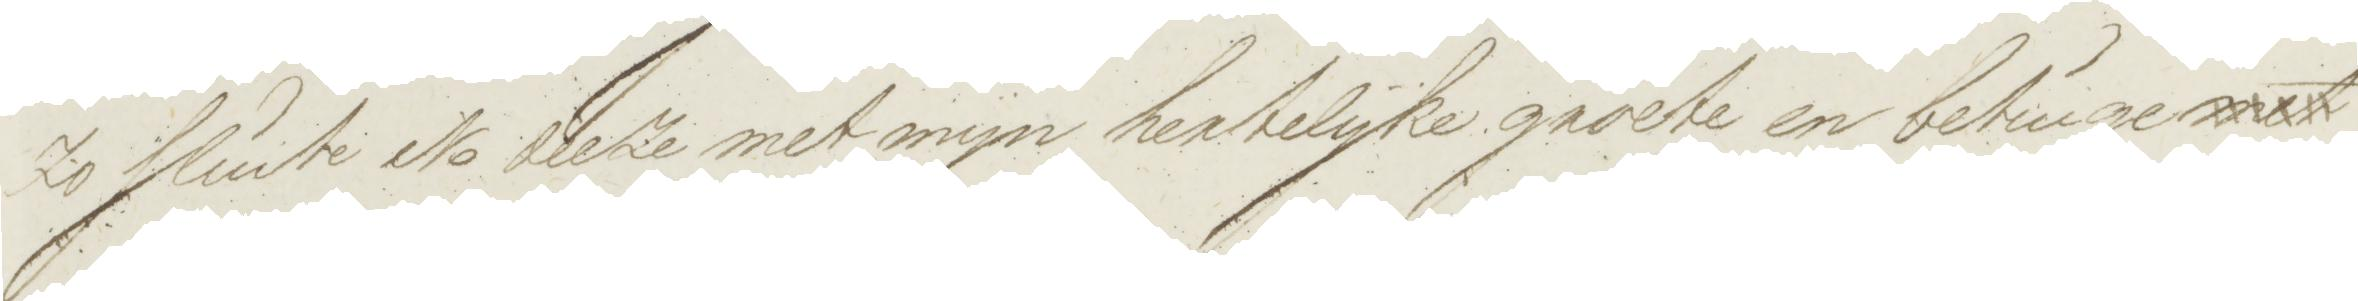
zo sluite ik deeze met mijn hertelijke groete en betuige met
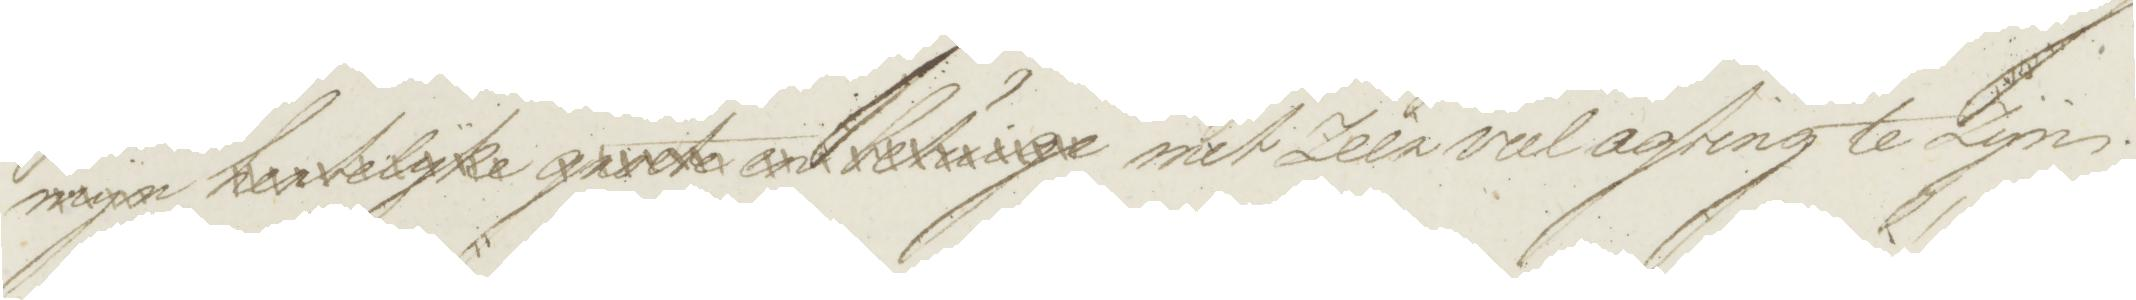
mijn hertelijke groete en betuige met zeer veel agting te zijn
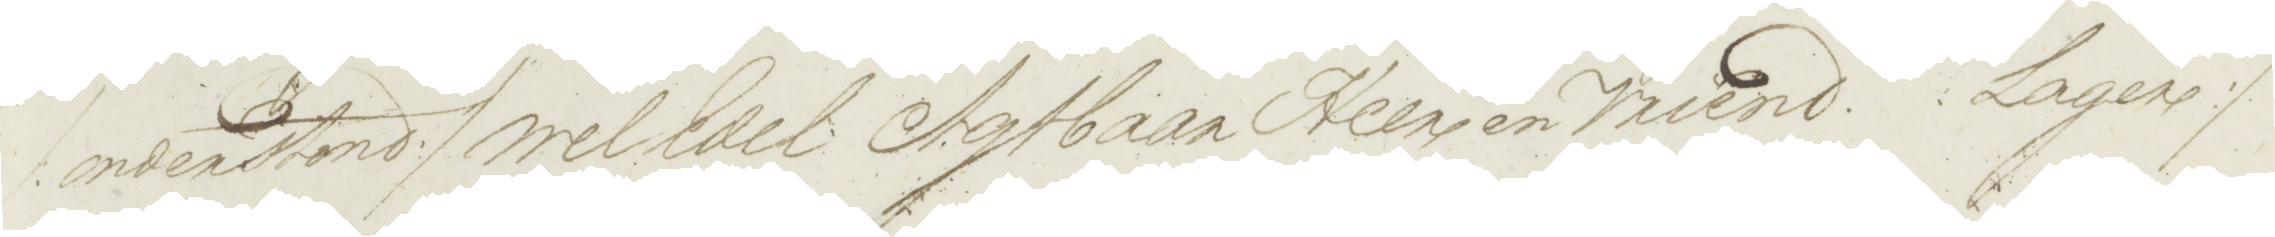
/:onderstond:/ welEdel Agtbaar Heer en Vriend. /:Lager:/
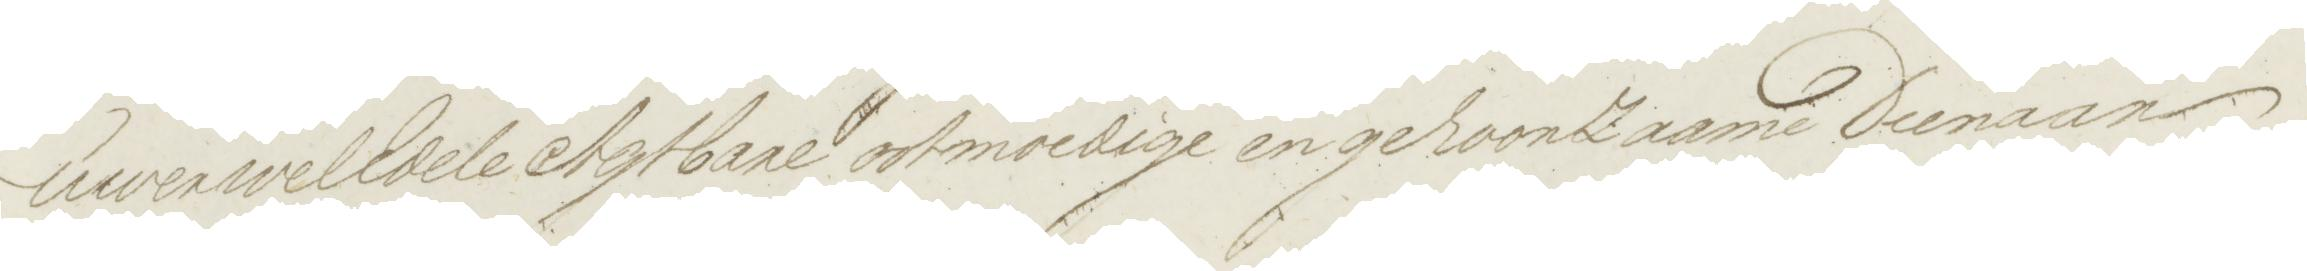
uwer welEdele Agtbare ootmoedige en gehoorzaame dienaar
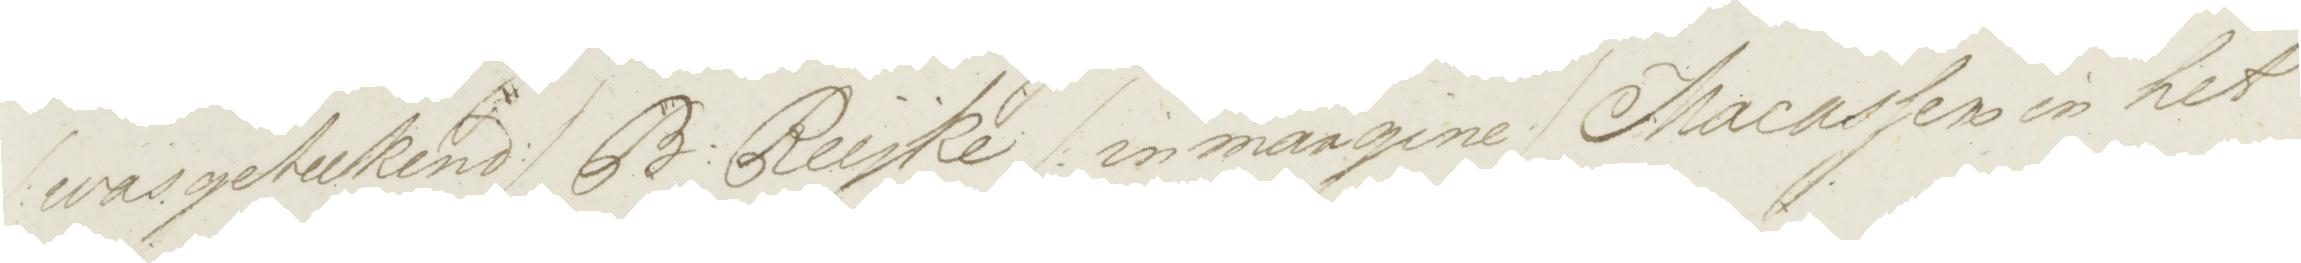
:was geteekend:/ B: Reijke /:in margine:/ Macasser in het
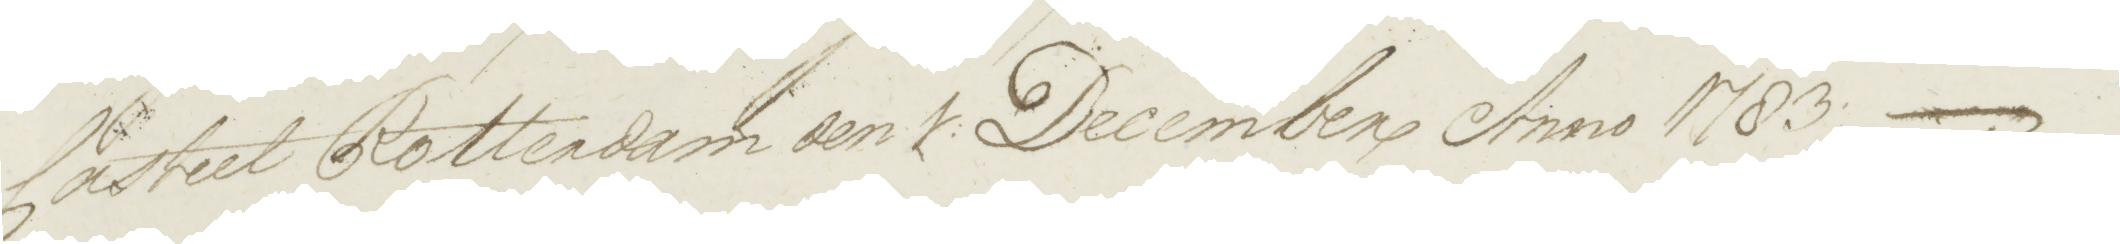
Casteel Rotterdam den 1: December Anno 1783.—
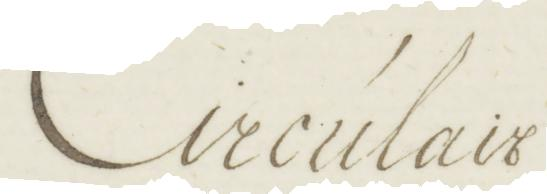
Circulair
